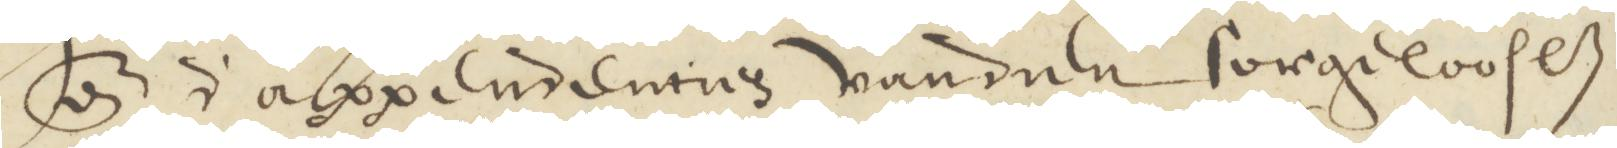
ende d’ appendentien van dien ter sorgeloosen
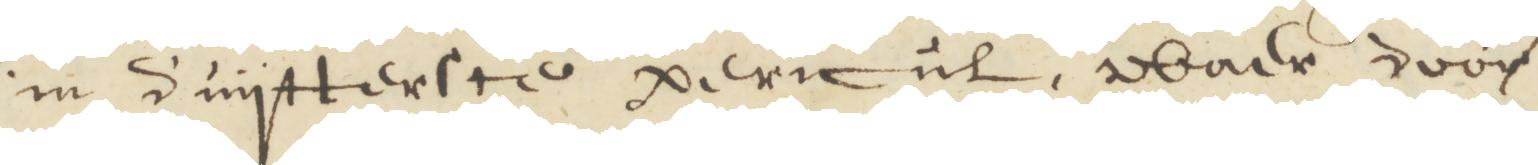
in d'uijtterste pericul, waer door
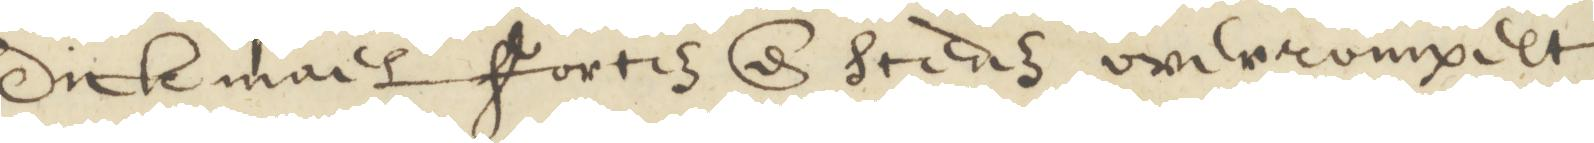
dickmael forten ende steden overrompelt
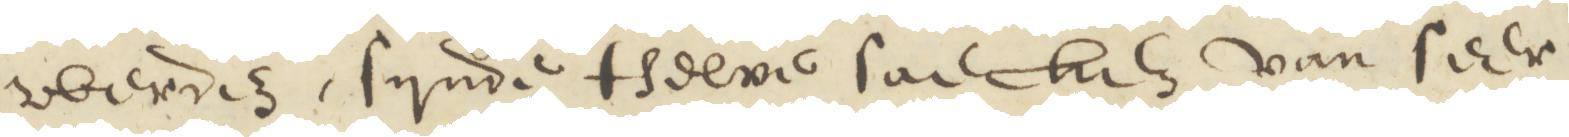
werden, synde tselve saecken van seer
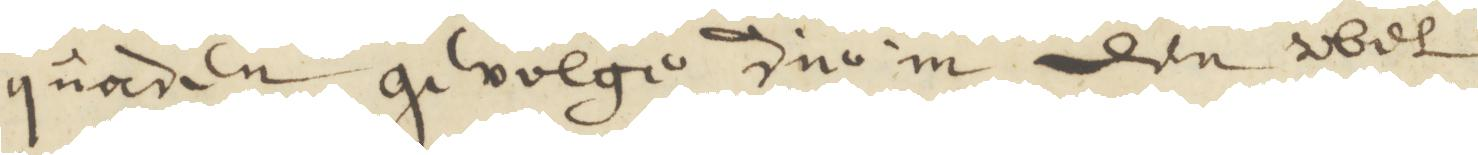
quaden gevolge die in een wel
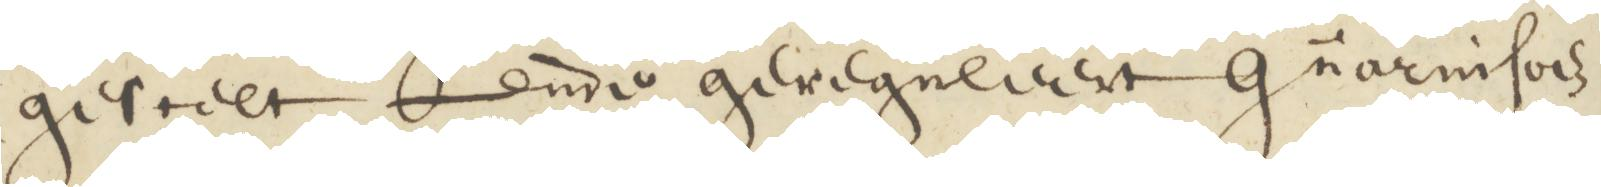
gestelt ende gereguleert guarnisoen
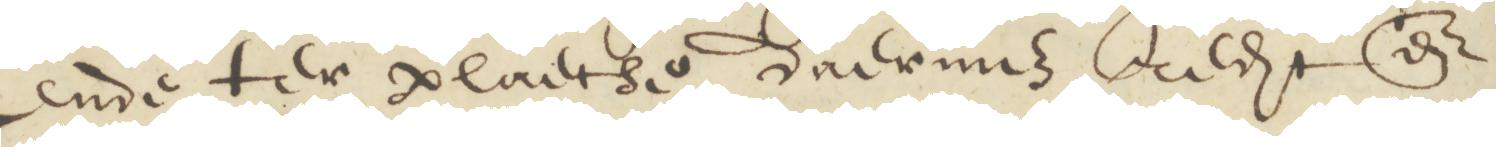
ende ter plaetse daer men recht ende
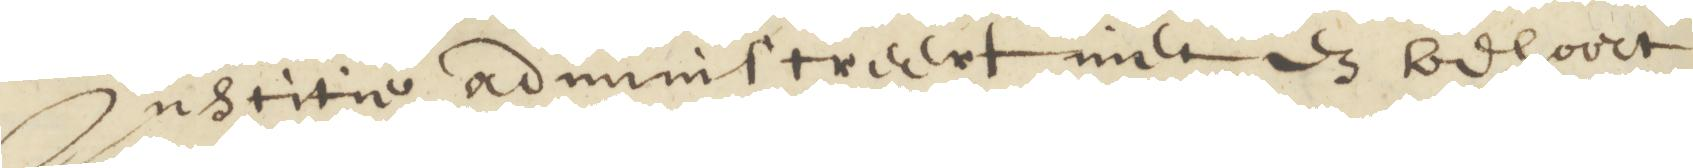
Justitie administreert niet en behoort
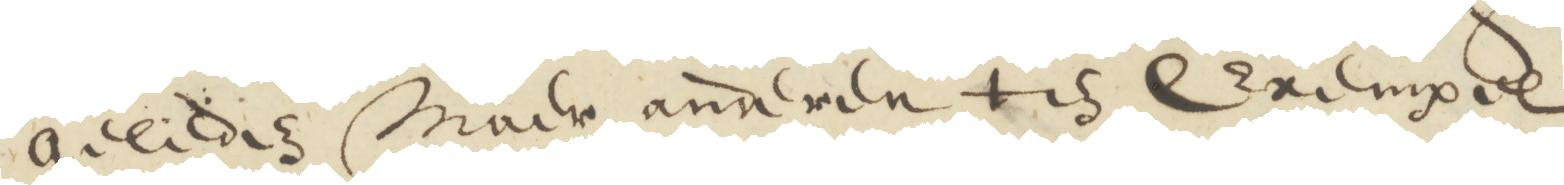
geleden maer anderen ten Exempel
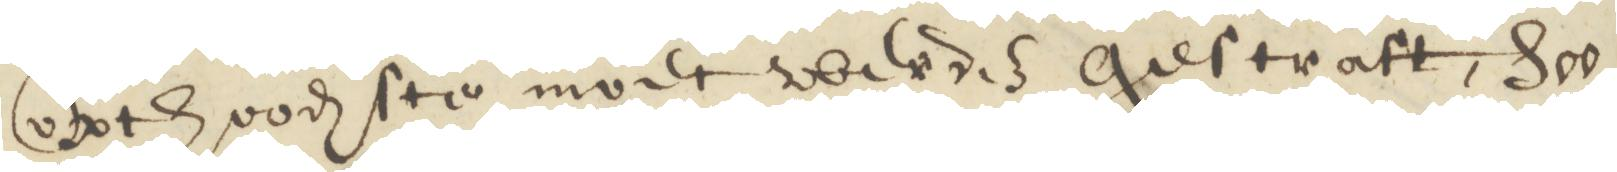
opt hoochste moet werden gestraft, soo
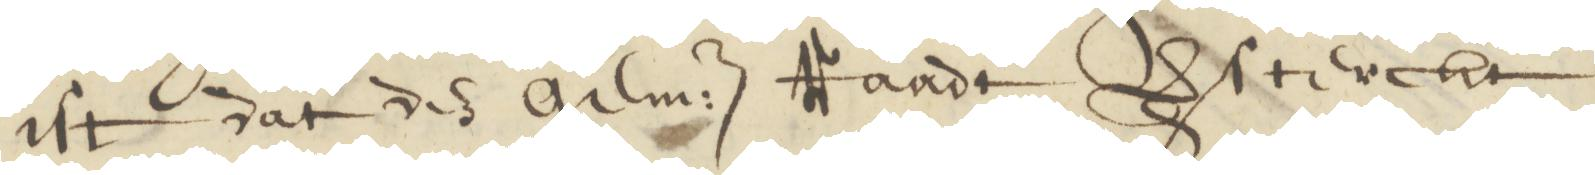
ist dat den gem:n Raadt versterckt
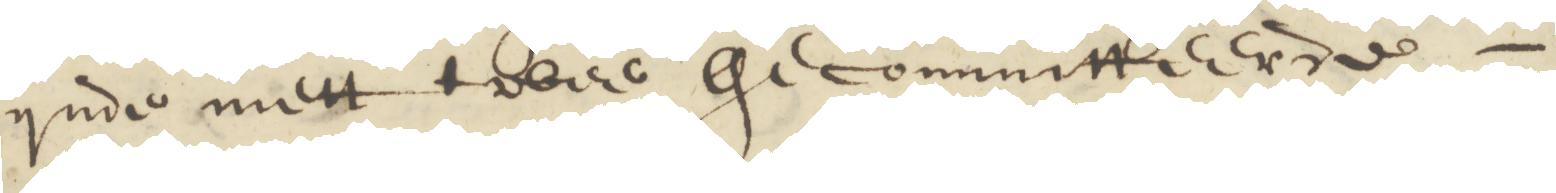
ynde mett twee gecommitteerde —
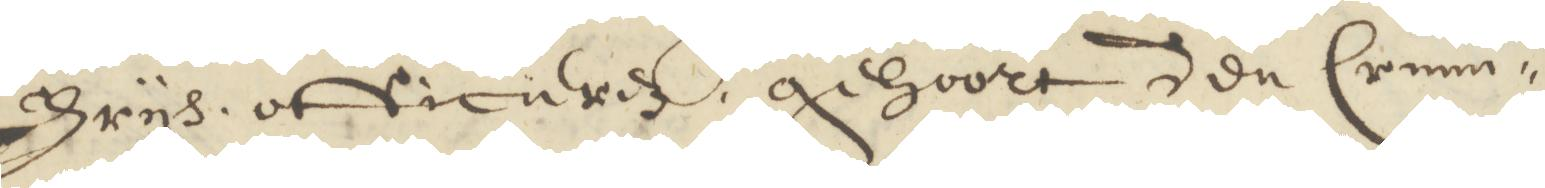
Drijs. officieren, gehoort den Crimi„
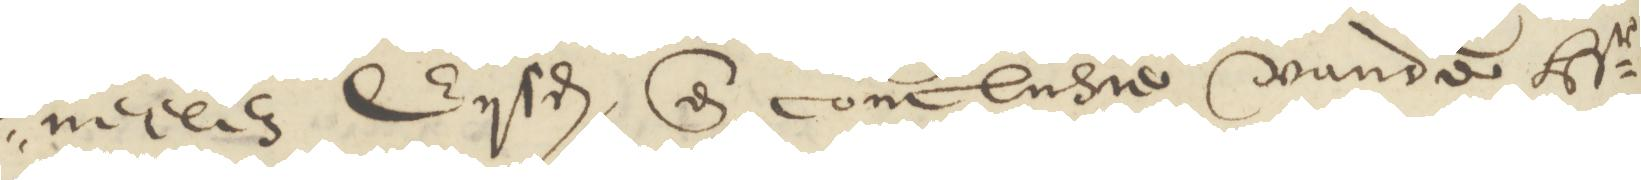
„neelen Eysch, ende conclusie vande H=r
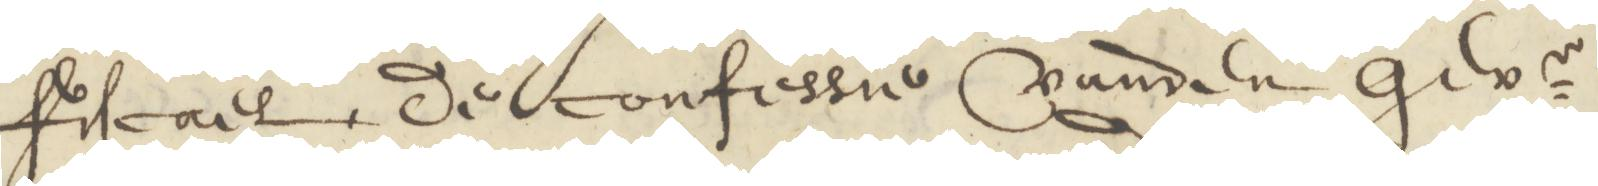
fiscael, de confessie vanden gev=e
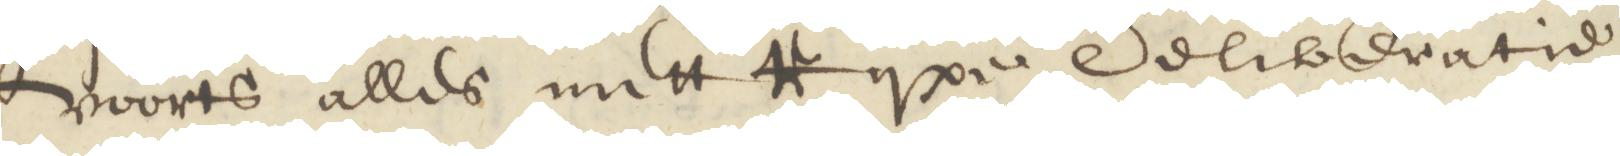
voorts alles mett Rype deliberatie
